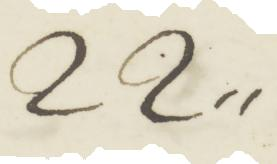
22„
